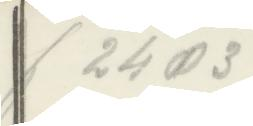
ƒ 2483
